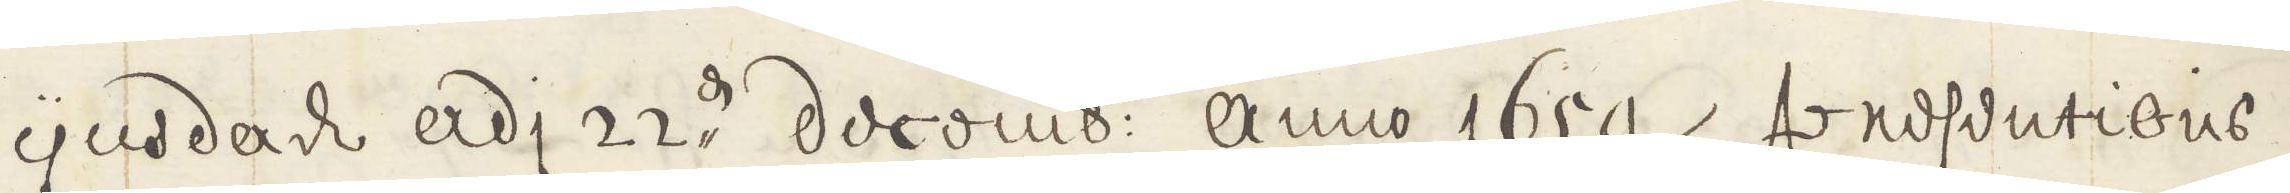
Dijnsdach adj 22„e decemb:r anno 1654 presentibus
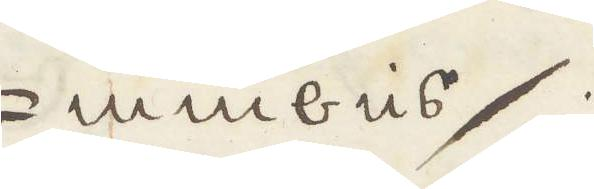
omnibus/
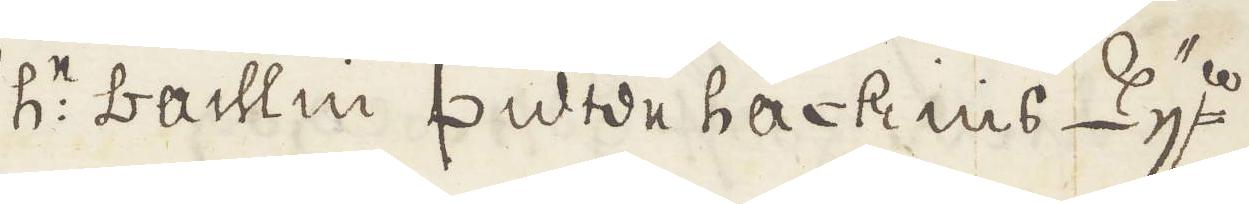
h:r bailliu pieter hackius Eij=r
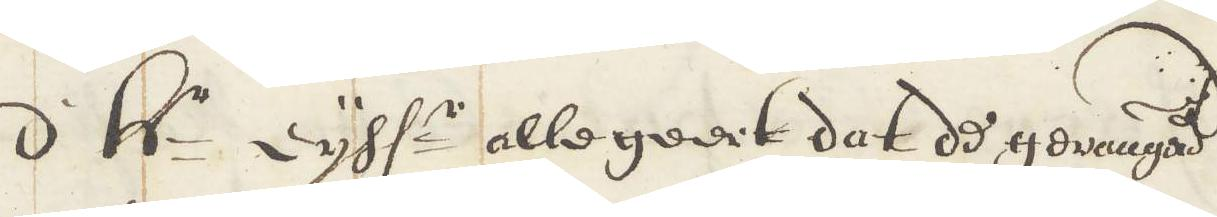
d’ H=r eijss=r alle geert dat de gevangene
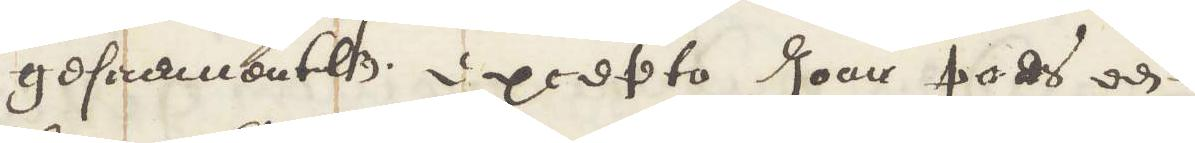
gesaementlijk excepto Joan paes een
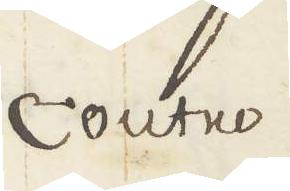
Contro
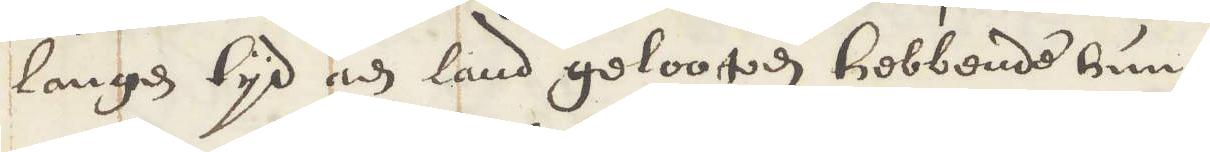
langen tijd aen land geloopen hebbende hun
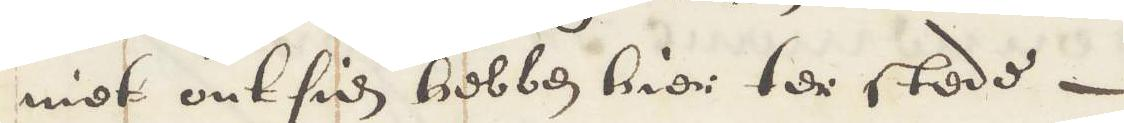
niet ontsien hebben hier ter stede —
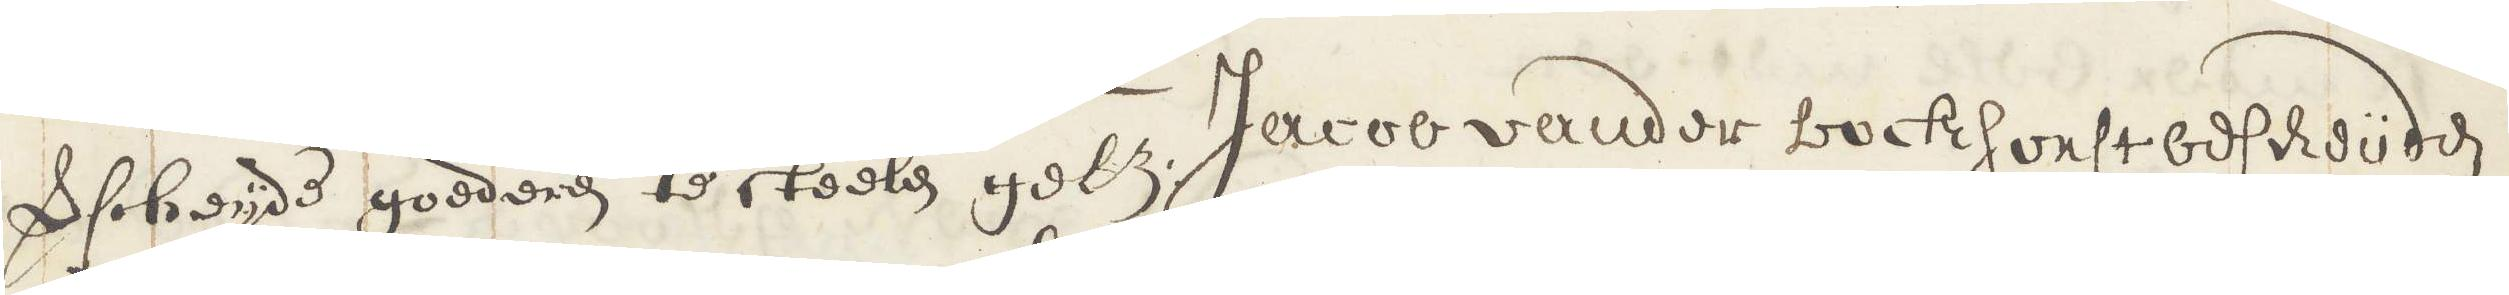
verscheijde goederen te steelen gelijk Jacob vander bockhorst bescheijden
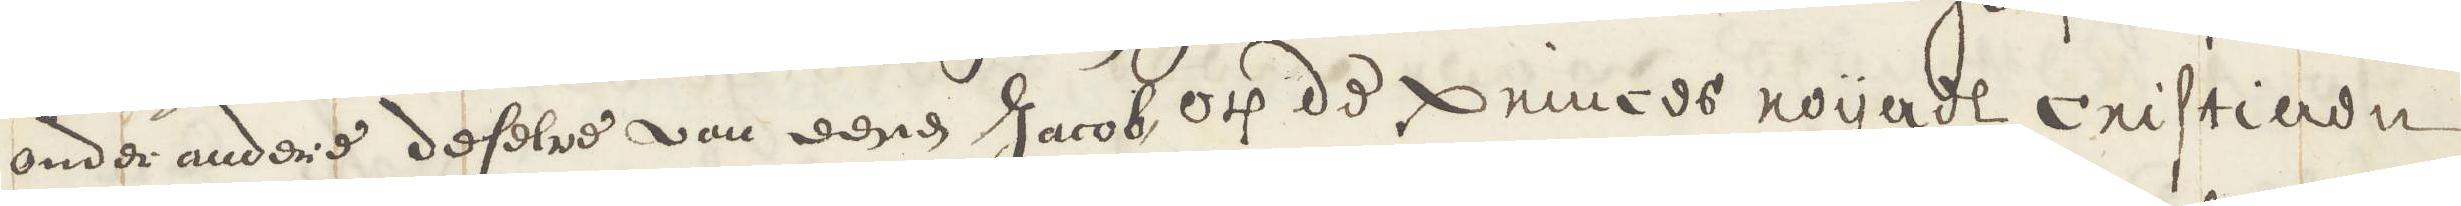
onder andere deselve van eenen Jacob, op de princes roijael cristiaen
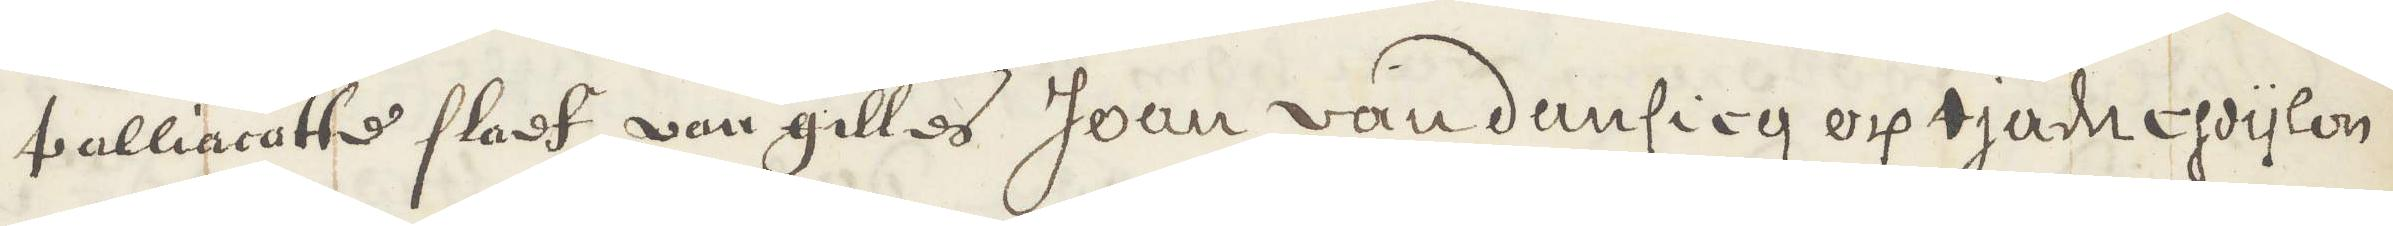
palliacatte slaef van gilles Joan van dansicq op tjach cheijlon
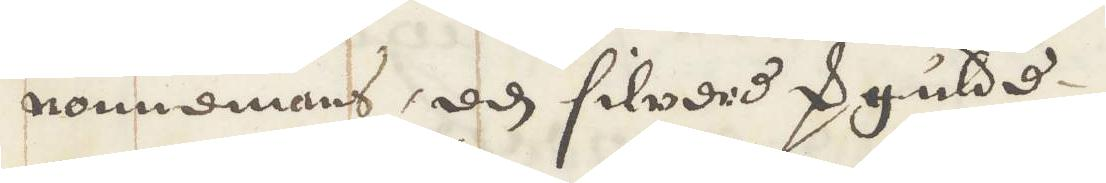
nonnemans, een silvere vergulde
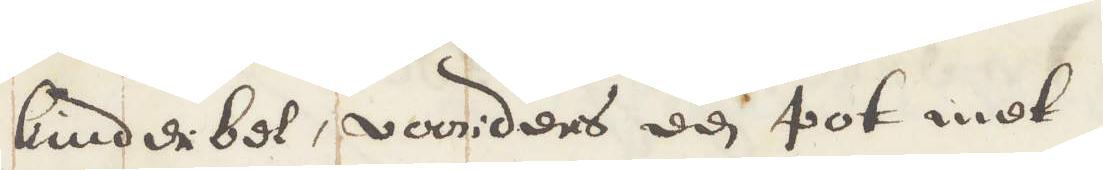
kinderbel, voorders een pot met
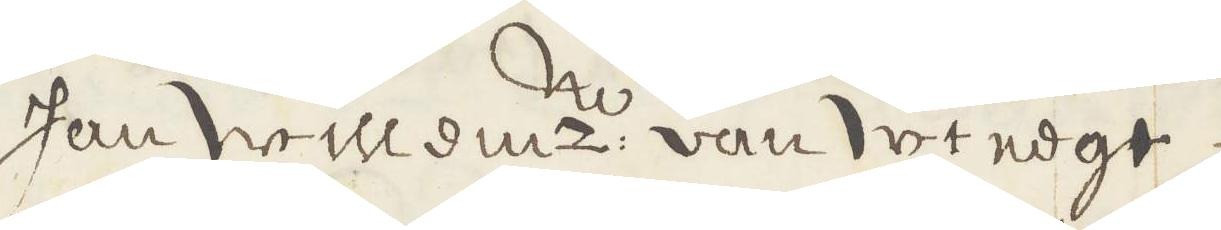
Jan Willemz: van wtregt
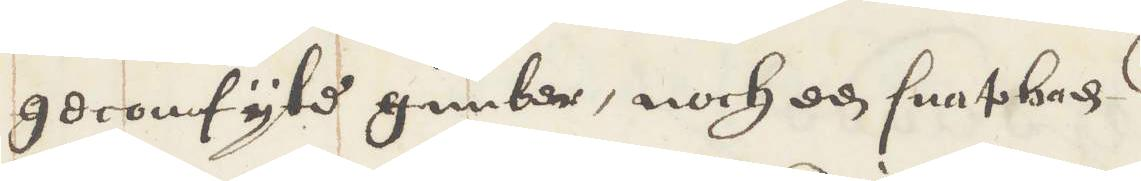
geconfijte gimber, noch een snaphaen
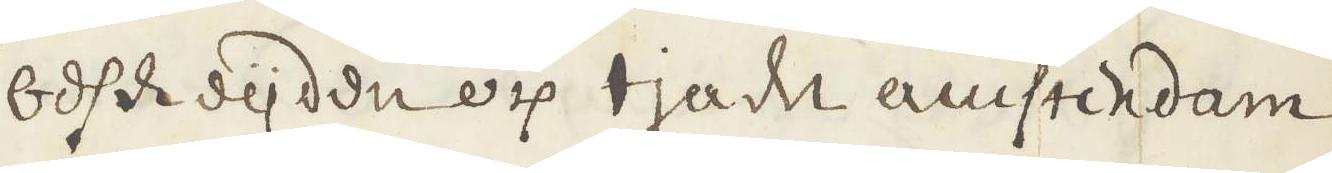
bescheijden op tjach amsterdam
